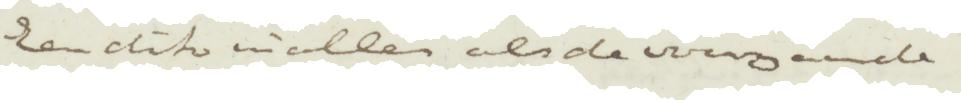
Een dito in alles als de voorgaande
